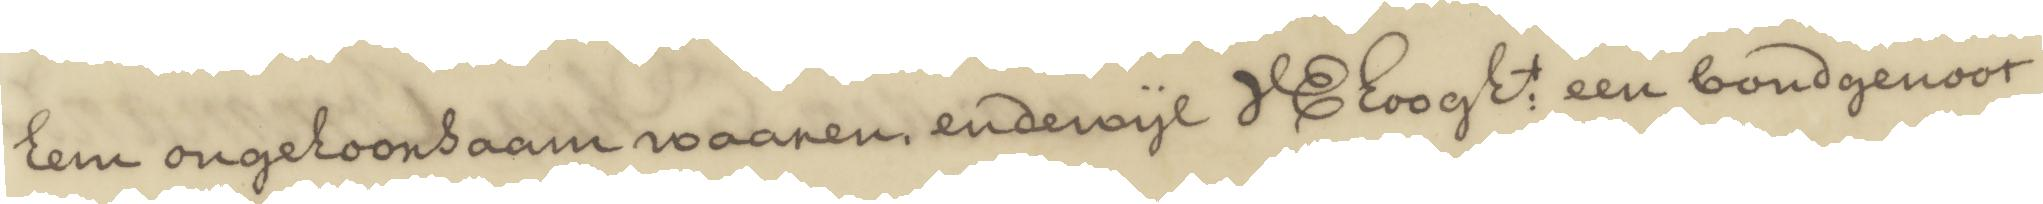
hem ongehoorsaam waaren, en dewijl VE hoogh:t een bondgenoot
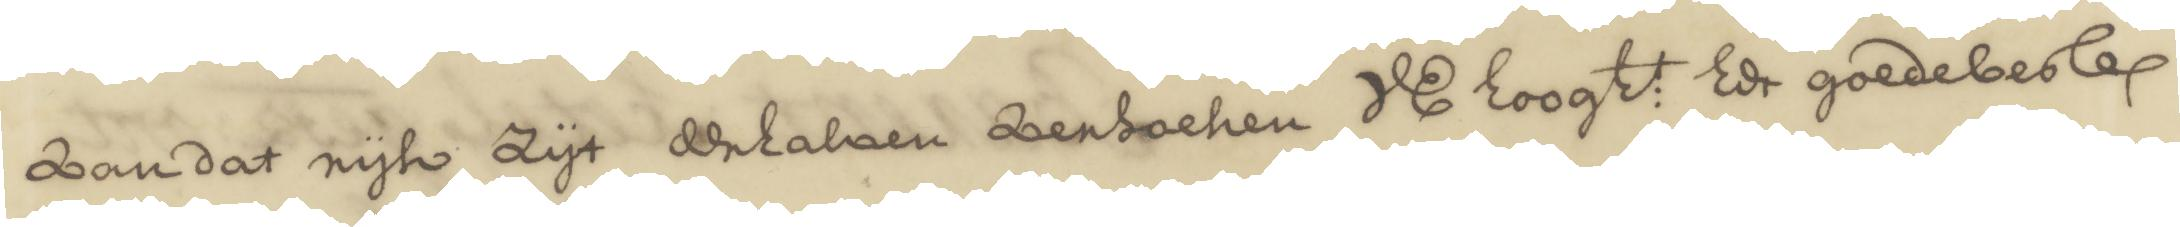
van dat rijk zijt derhalven versoeken VE hoogh:t het goedebeste
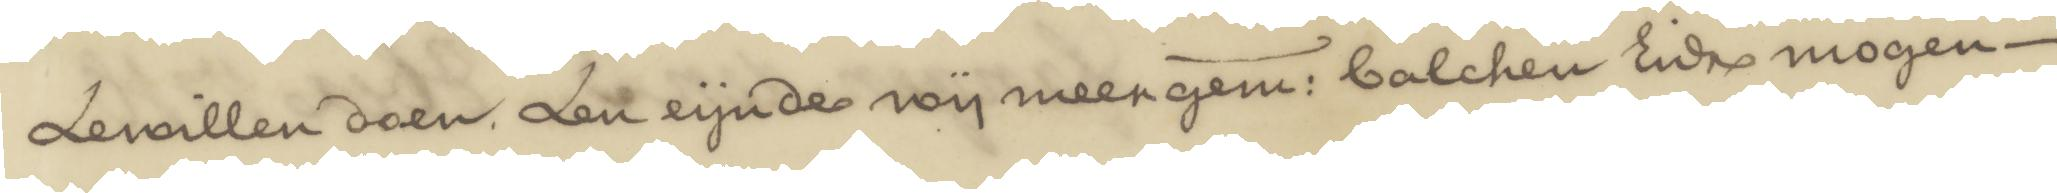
tewillen doen, ten eijnde wij meer gem: balcken hier mogen —
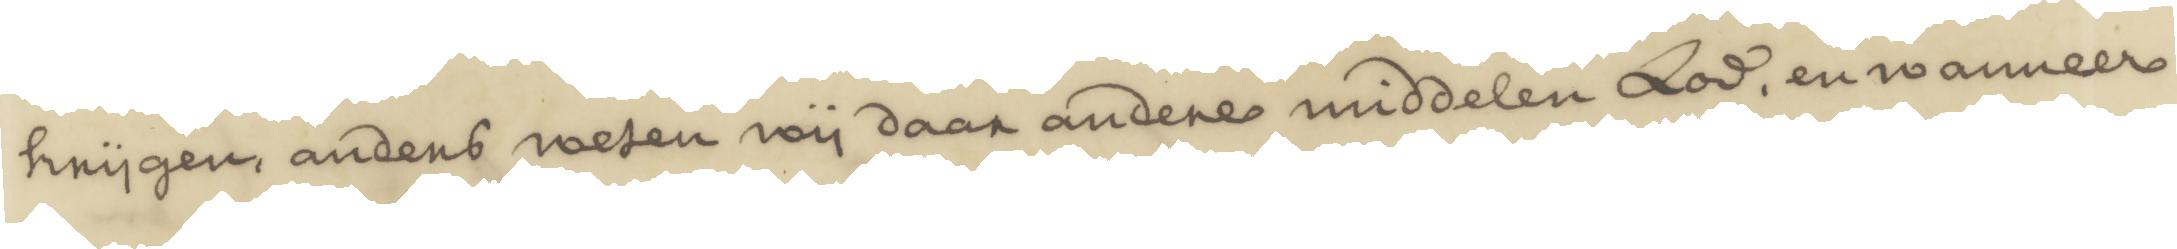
krijgen, anders wesen wij daar andere middelen toe, en wanneer
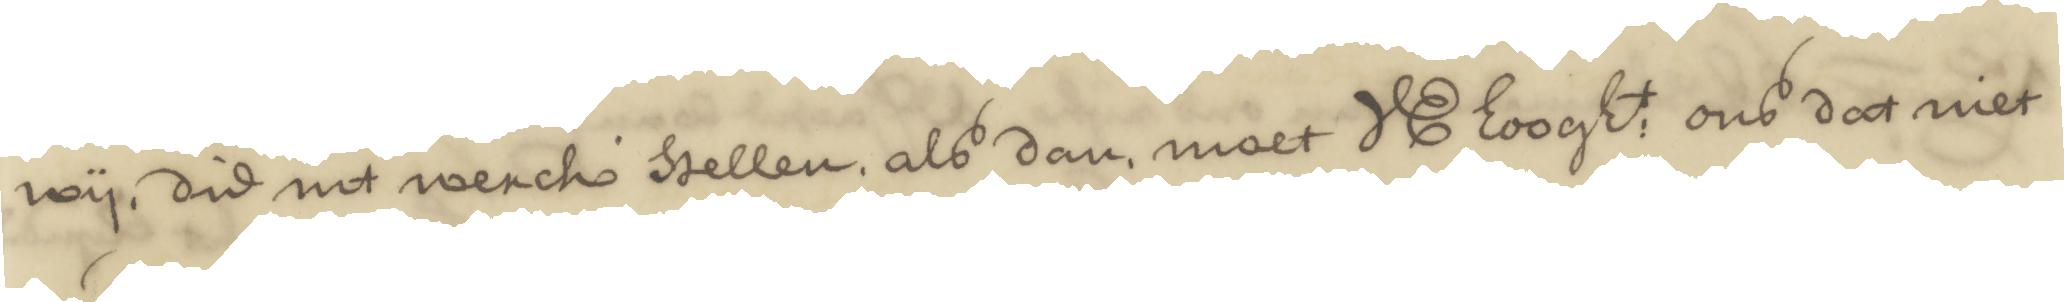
wij, die int werck stellen, als dan, moet VE hoogh:t ons dat niet
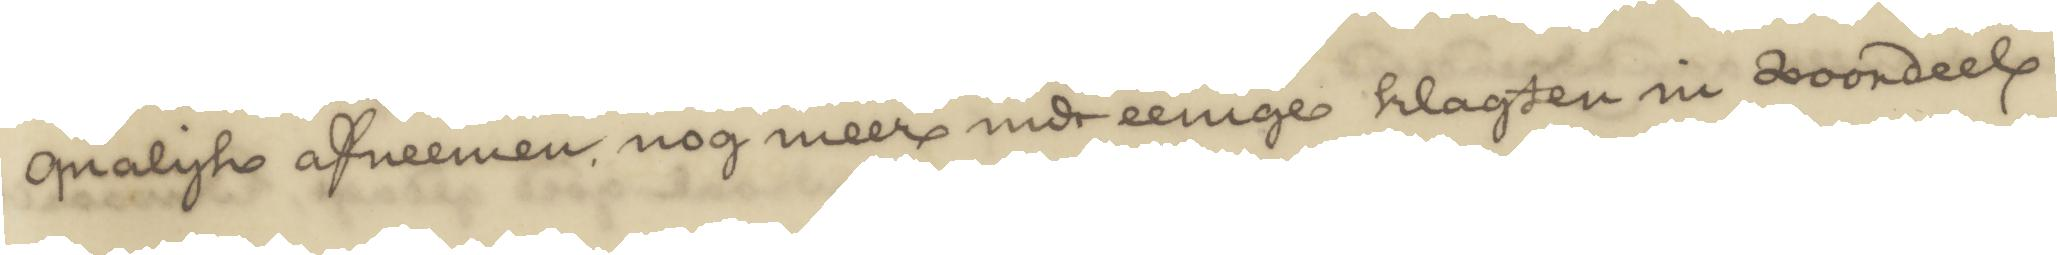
qualijk afneemen, nog meer met eenige klagten in voordeele
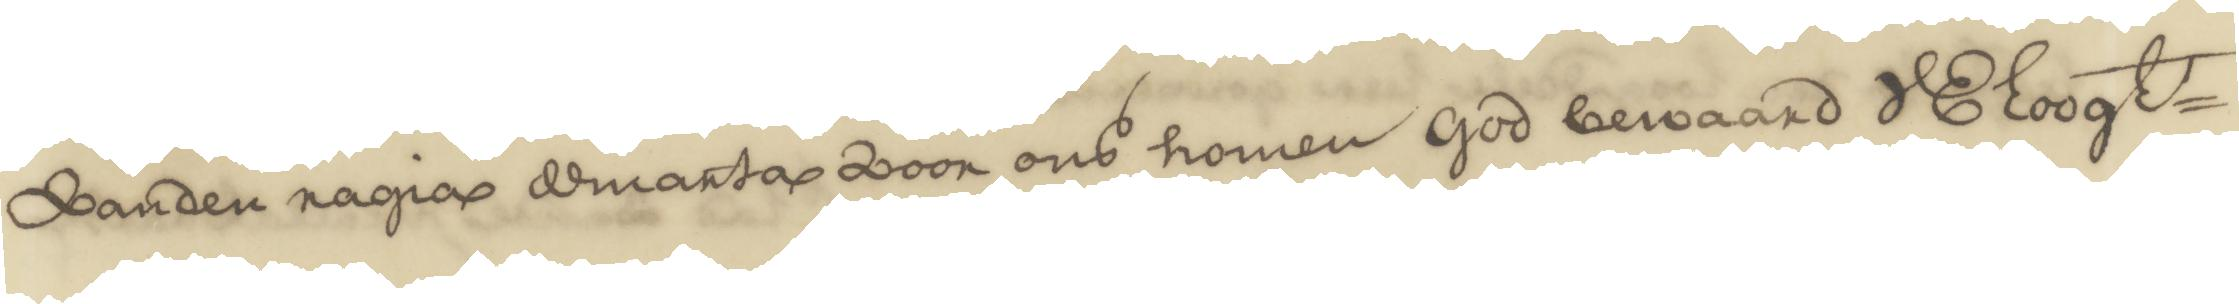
vanden ragia demarta voor ons komen god bewaard VE hoogh=t
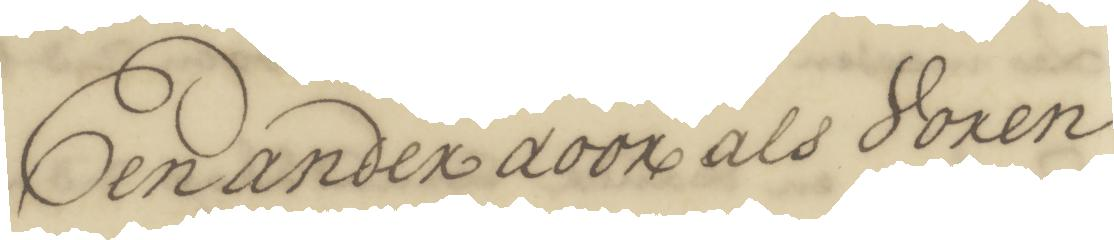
Een ander door als Voren
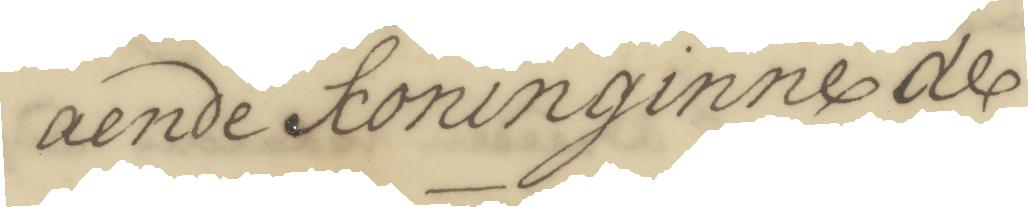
aende koninginne de
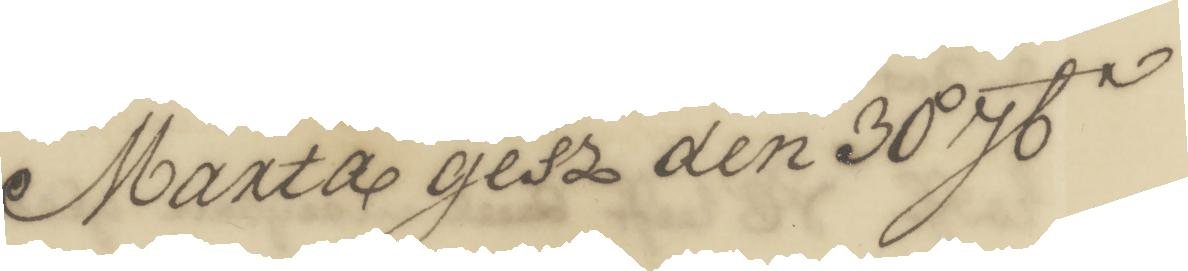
Marta gesz den 30' 7br
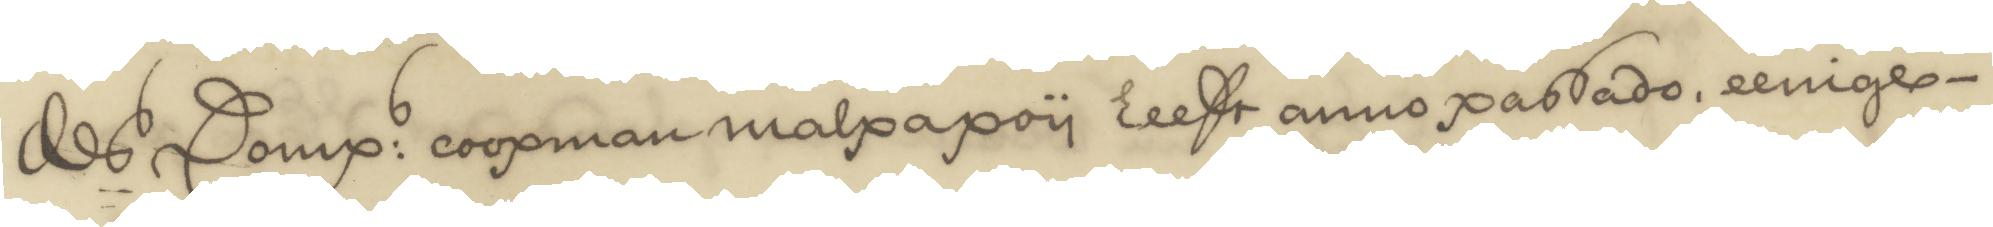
des Comp:s coopman malpapoij heeft anno passado, eenige –
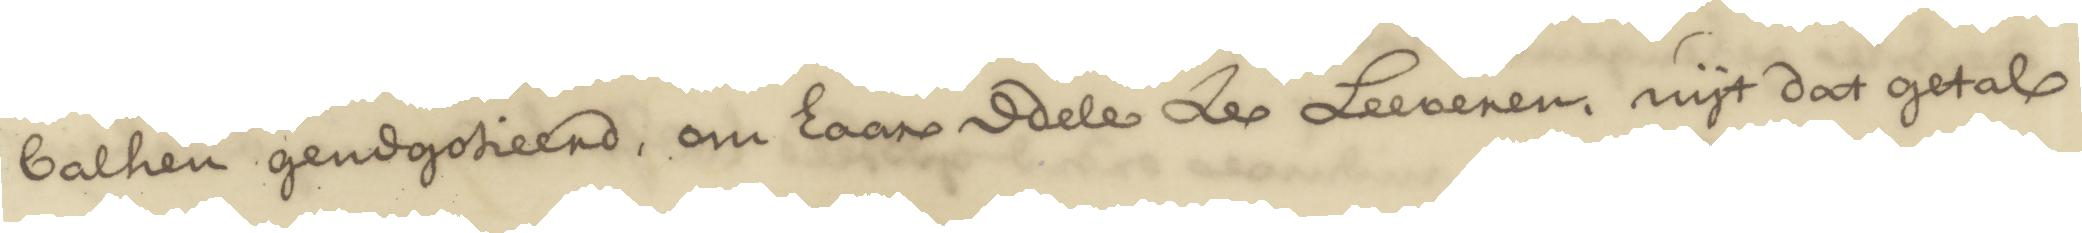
balken genegotieerd, om haar Edele te leeveren, uijt dat getal
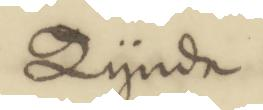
zijner
